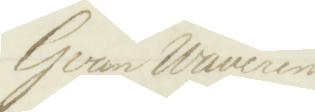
G van Waveren
